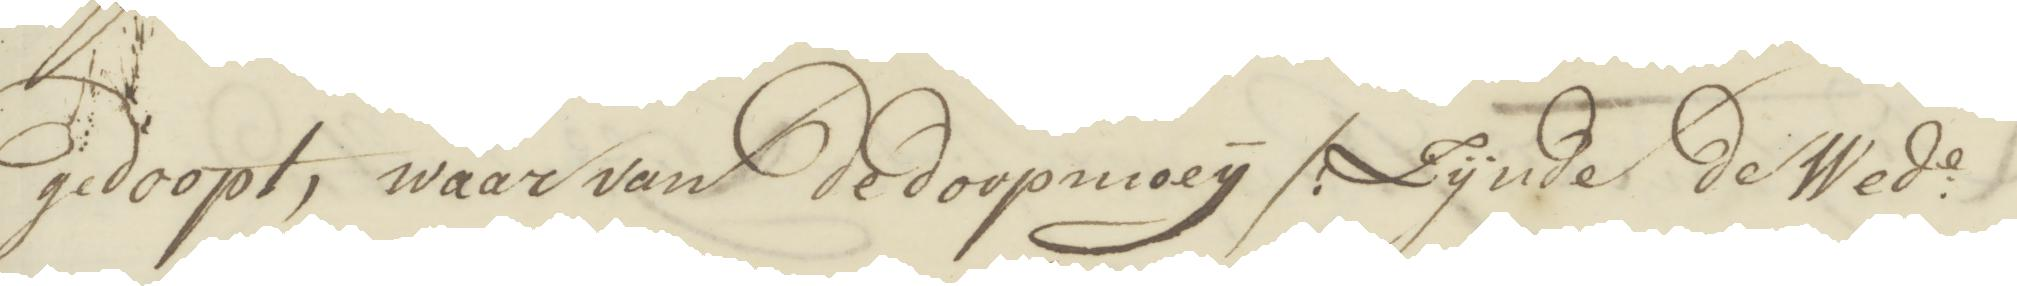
gedoopt, waar van de doop moeij /:zijnde de Wed:e
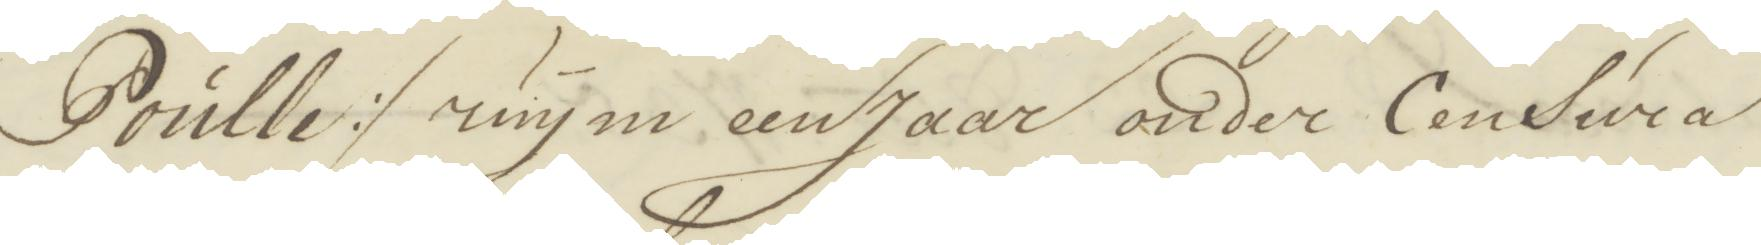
Poulle:/ ruijm een Jaar onder Censura
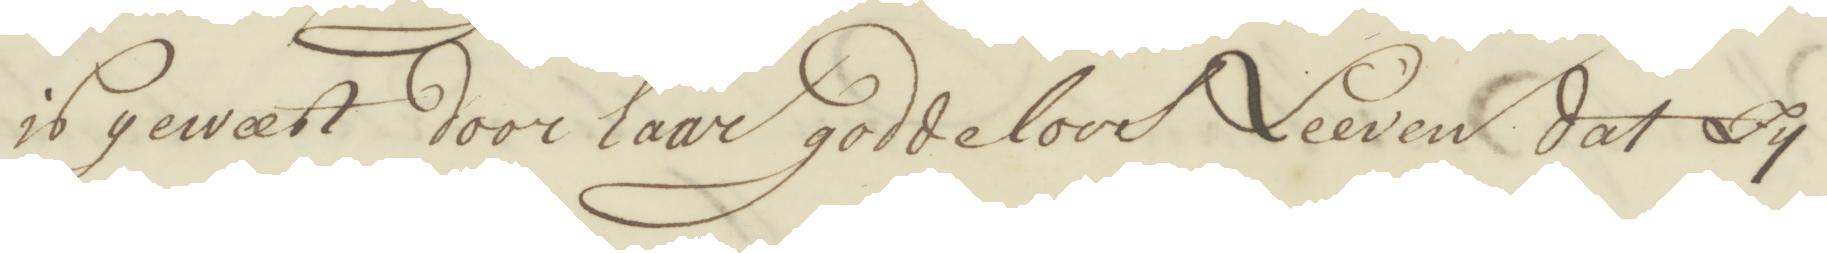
is geweest door haar goddeloos Leeven dat zij
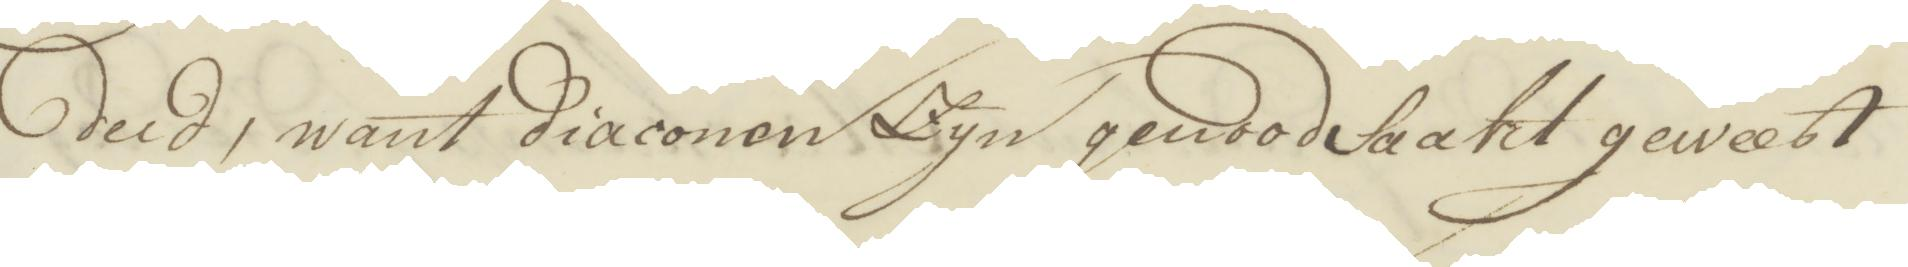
deed, want diaconen zijn genoodsaakt geweest
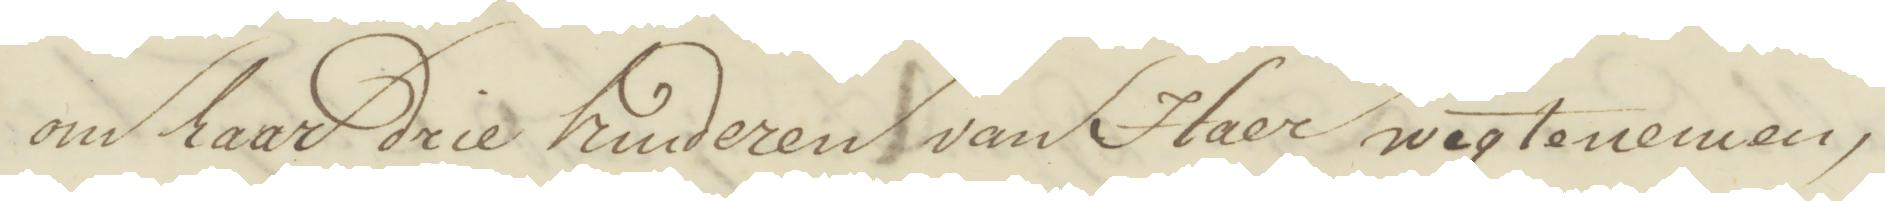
om haar drie kinderen van Haer wegtenemen,
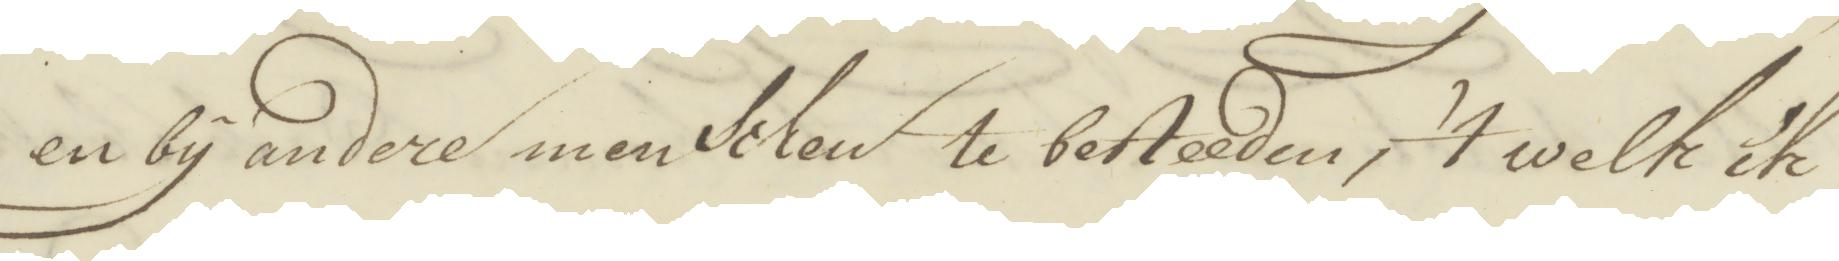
en bij andere menschen te besteeden, ’t welk ik
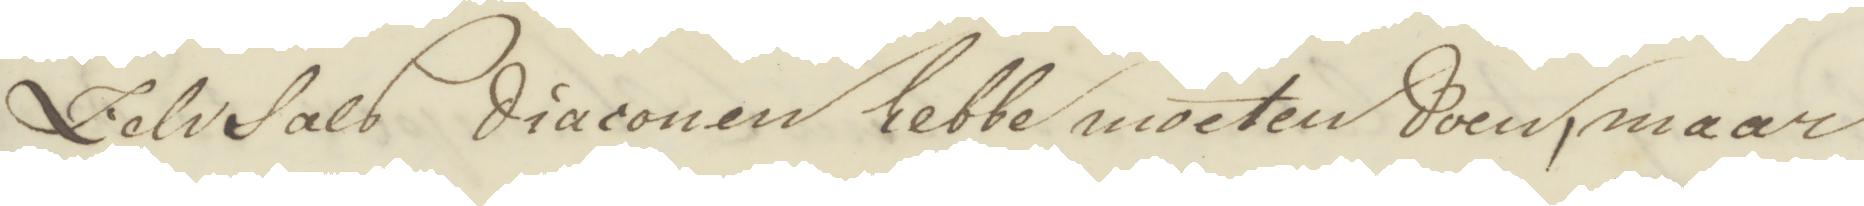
zelvs als diaconen hebbe moeten doen, maar
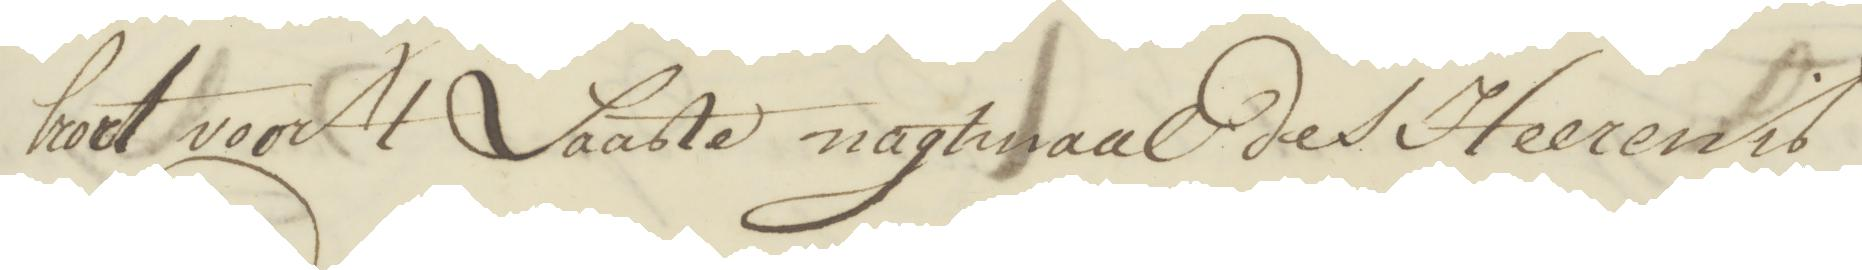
kort voor ’t Laaste nagtmaal des Heeren is
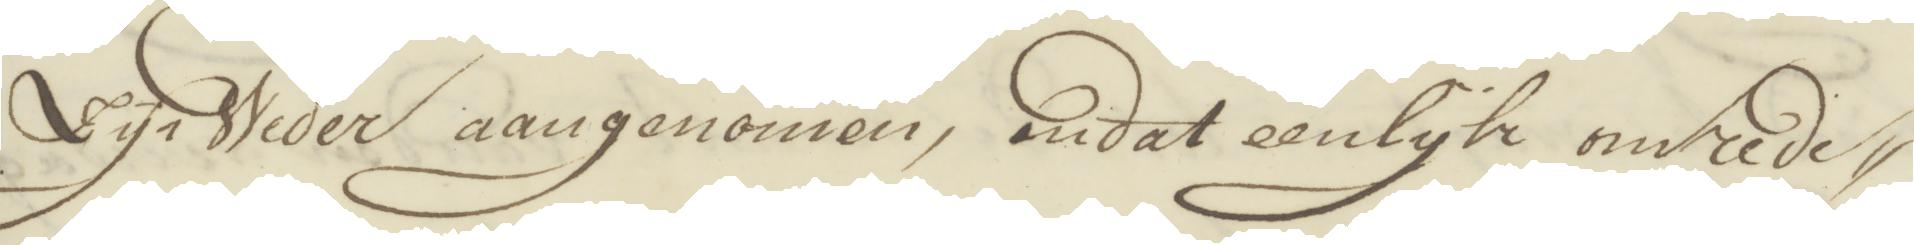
zijn weder aangenomen, en dat eenlijk om rede„
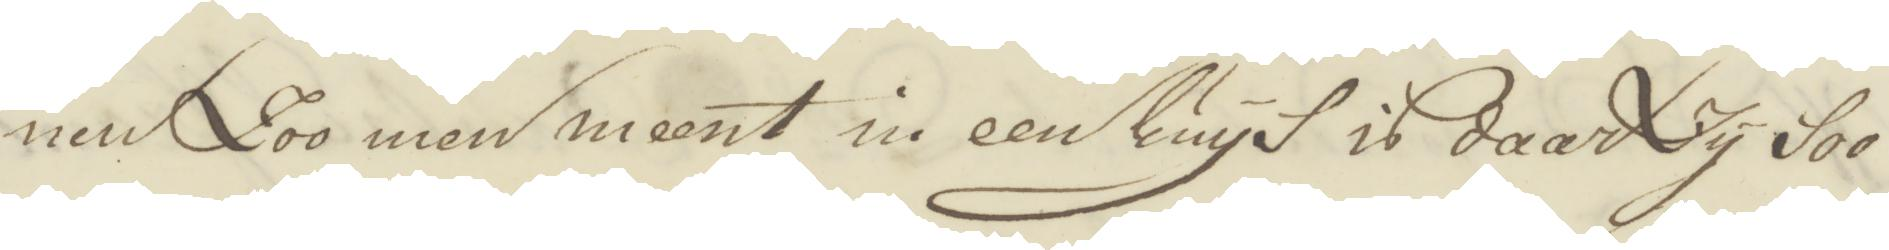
nen zoo men meent in een huijs is daar zij soo
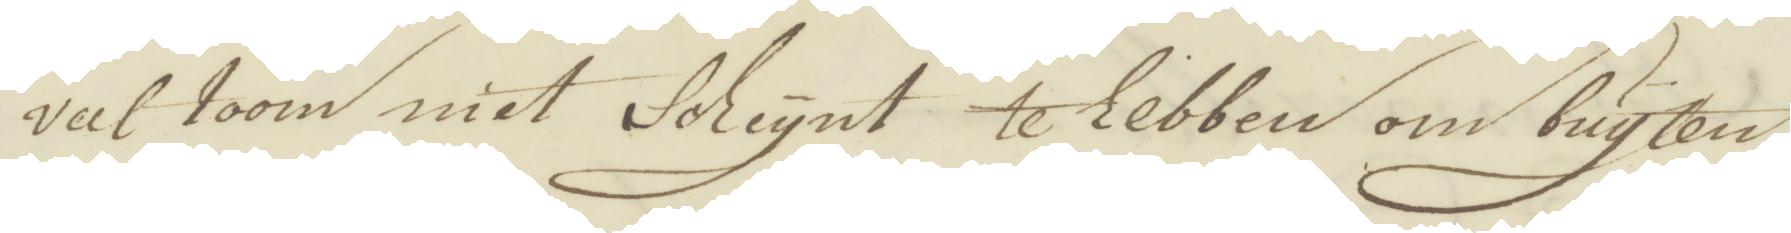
veel toom niet scheijnt te hebben om buijten
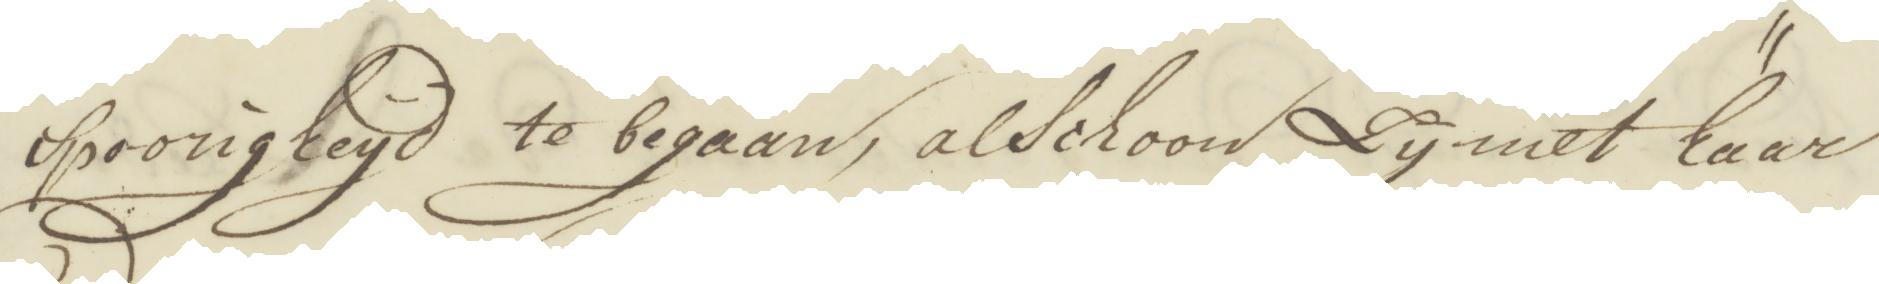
spoorigheijd te begaan, alschoon zij met haar
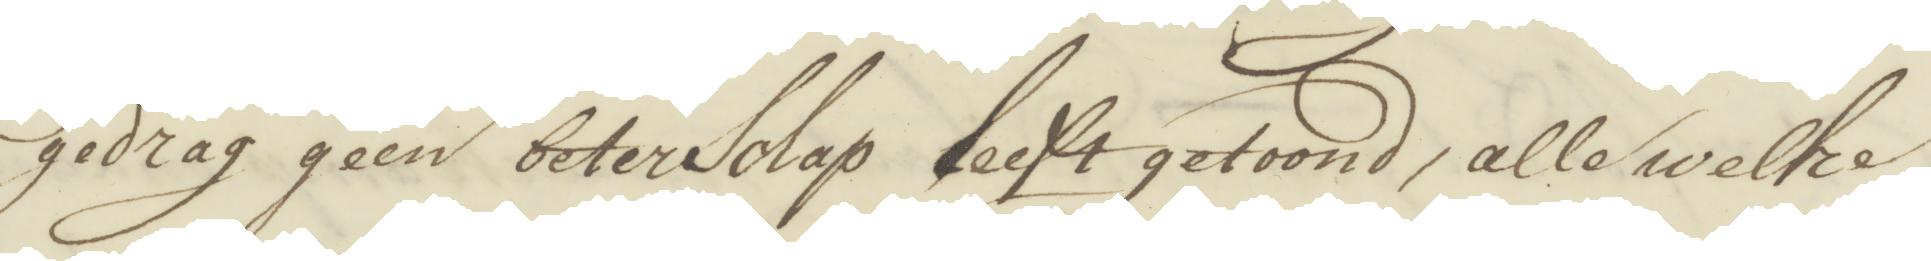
gedrag geen beterschap heeft getoond, alle welke
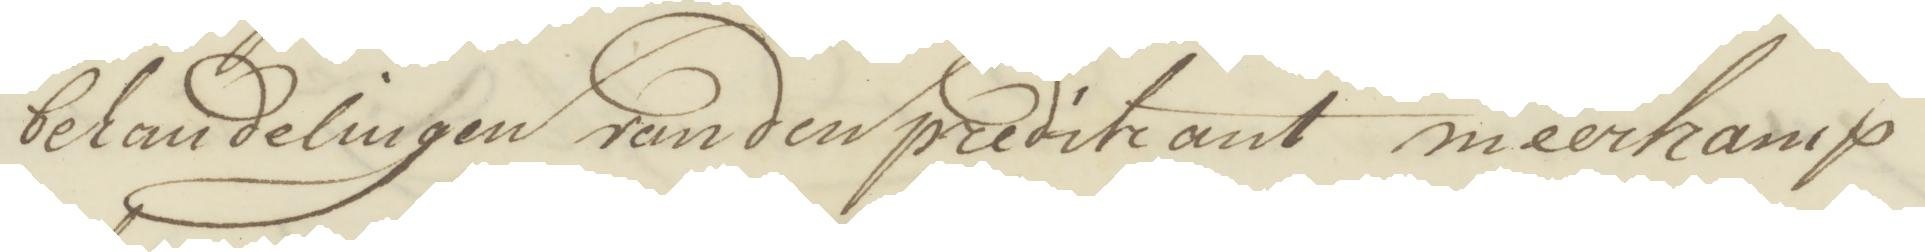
behandelingen van den predikant meerkamp
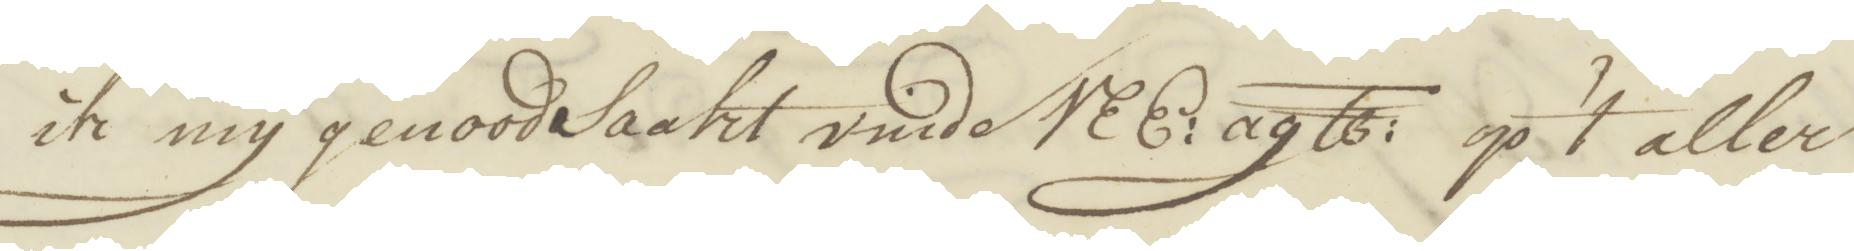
ik mij genoodsaakt vinde VE E: agtb: op ’t aller
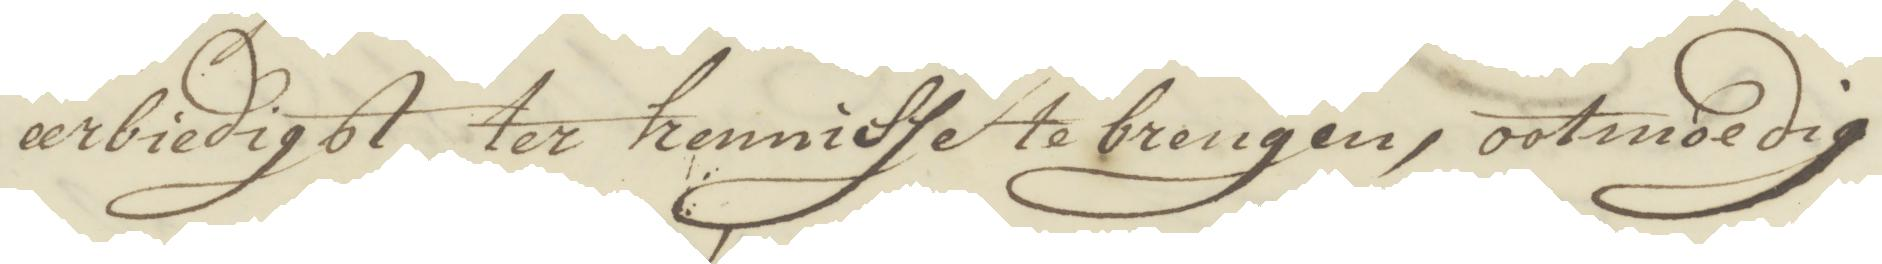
eerbiedigst ter kennisse te brengen, ootmoedig
